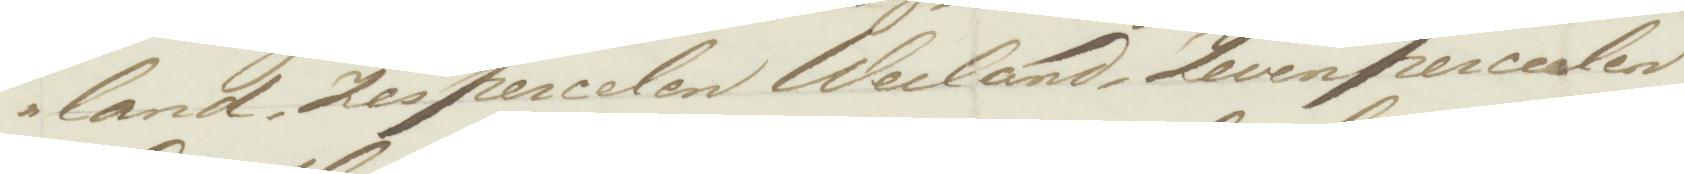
„land, Zes percelen Weiland, Zeven perceelen
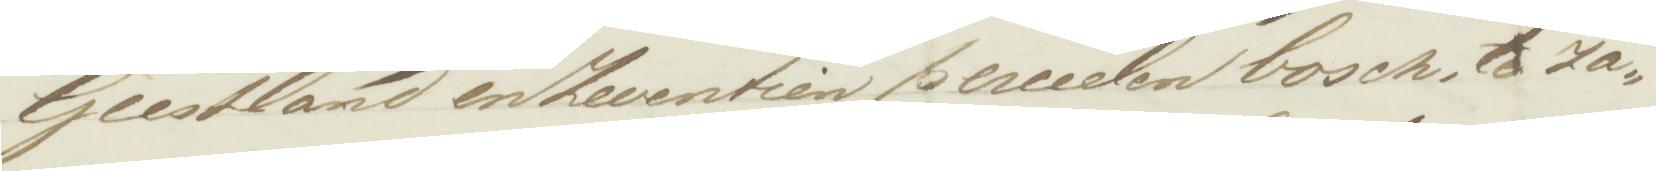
Geestland en zeventien perceelen bosch, te za„
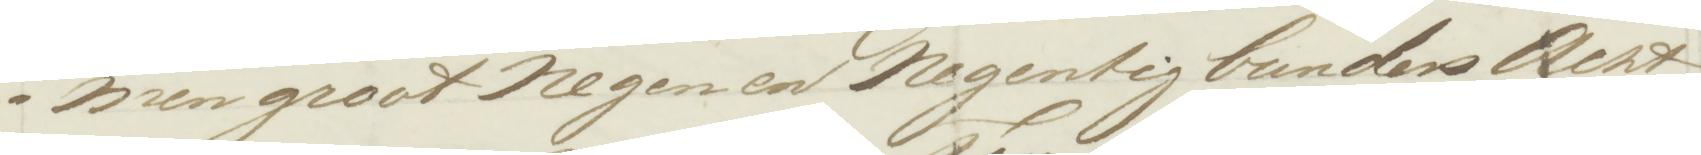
„men groot Negen en Negentig bunders Acht
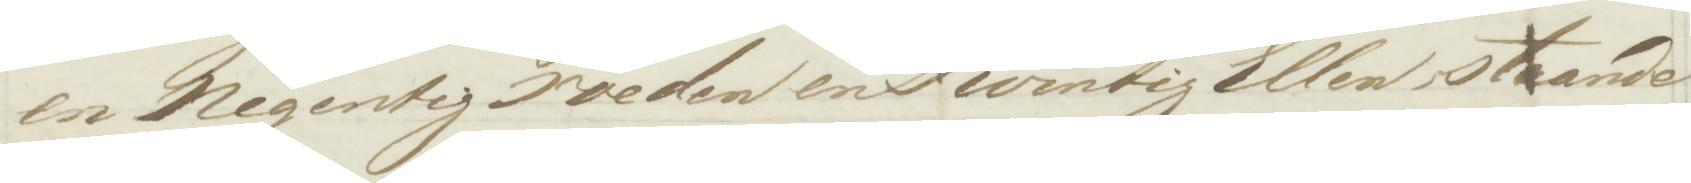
en Negentig roeden en Twintig Ellen, staande
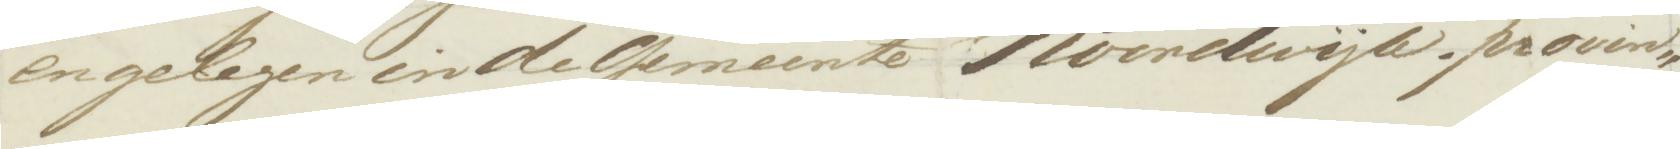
en gelegen in de Gemeente Noordwijk, provin„
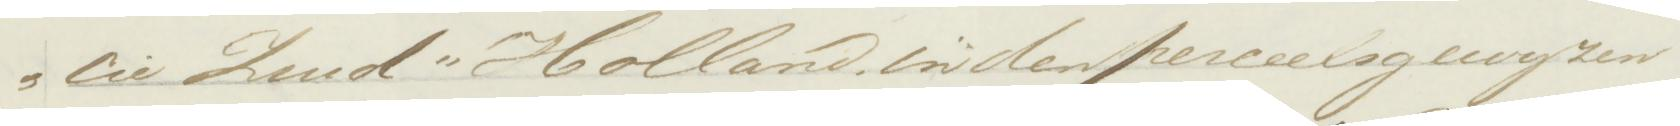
„cie Zuid " Holland, in den perceels gewyzen
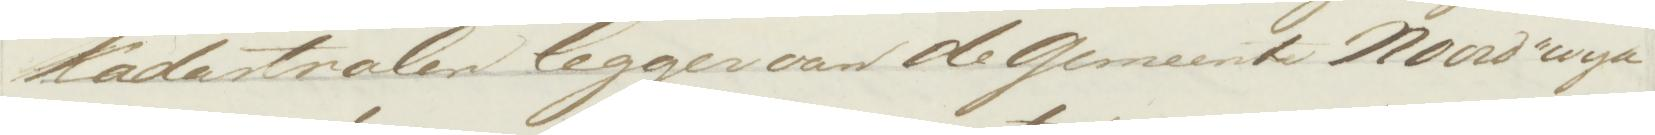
Kadastralen legger van de gemeente Noord " wyk
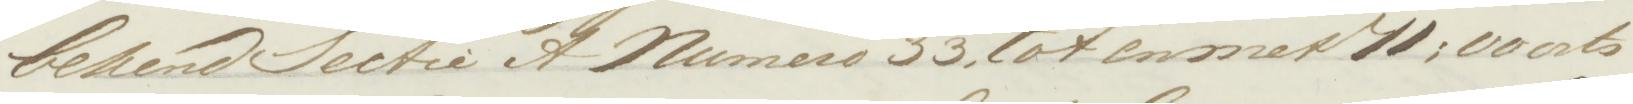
bekend Sectie A Numero 33, tot en met 71; voorts
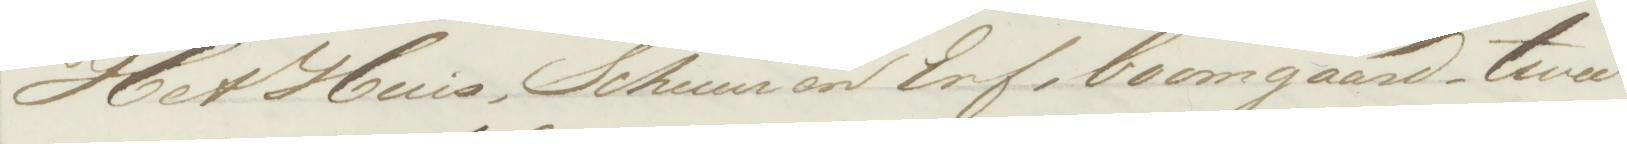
Het Huis, Schuur en Erf, boomgaard- twee
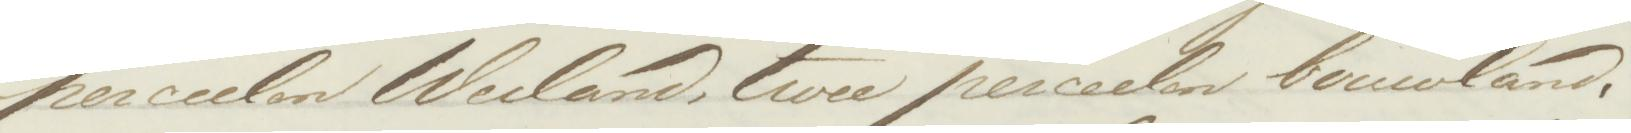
perceelen Weiland, twee perceelen bouwland,
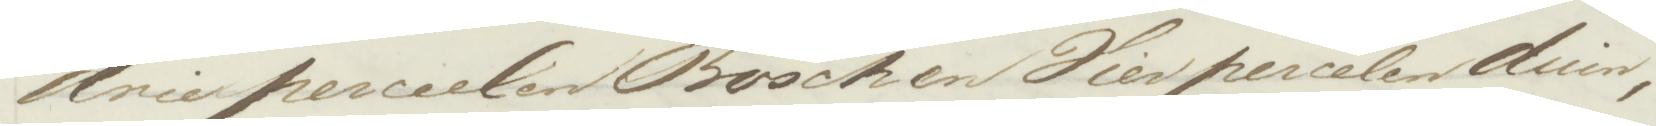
drie perceelen Bosch en Vier percelen duin,
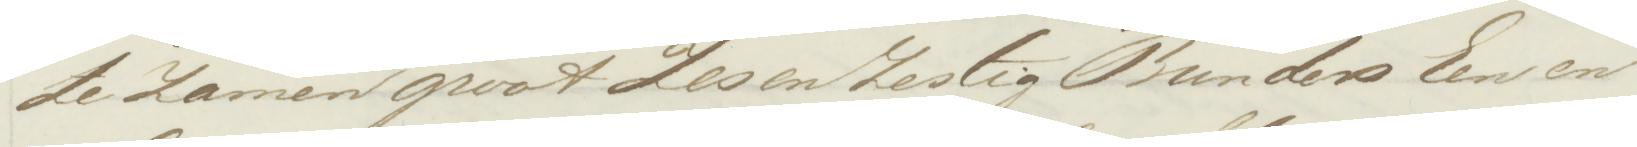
te zamen groot Zes en Zestig Bunder Een en
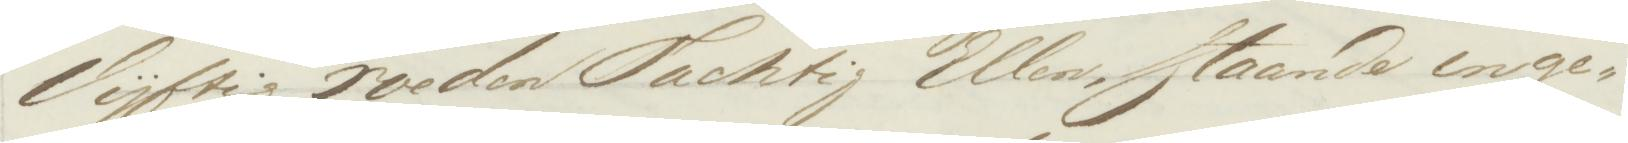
Vijftig voeden Tachtig Ellen, staande en ge„
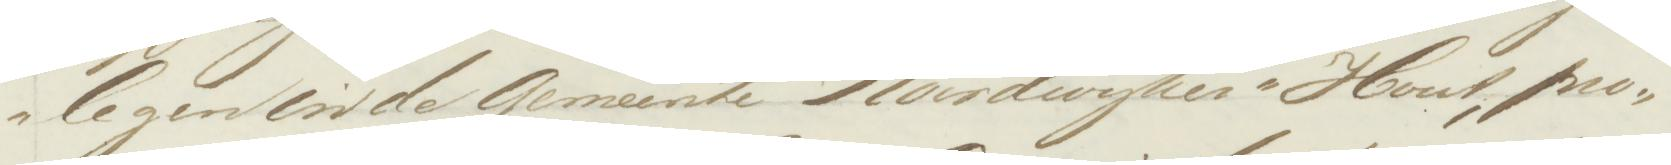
„legen in de Gemeente Noordwyker " Hout, pro„
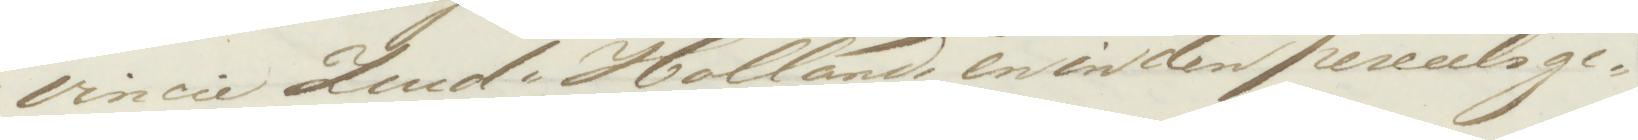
vincie Zuid " Holland, en in den perceels ge„
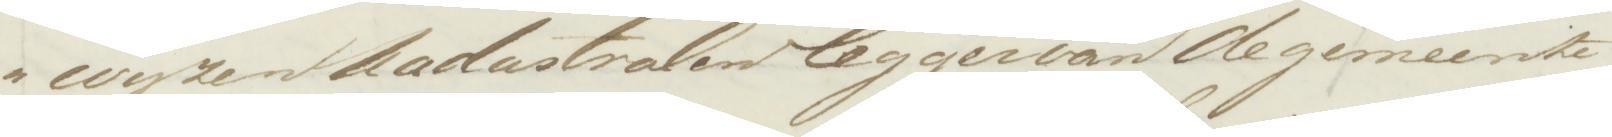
=wyzen kadastralen legger van de gemeente
